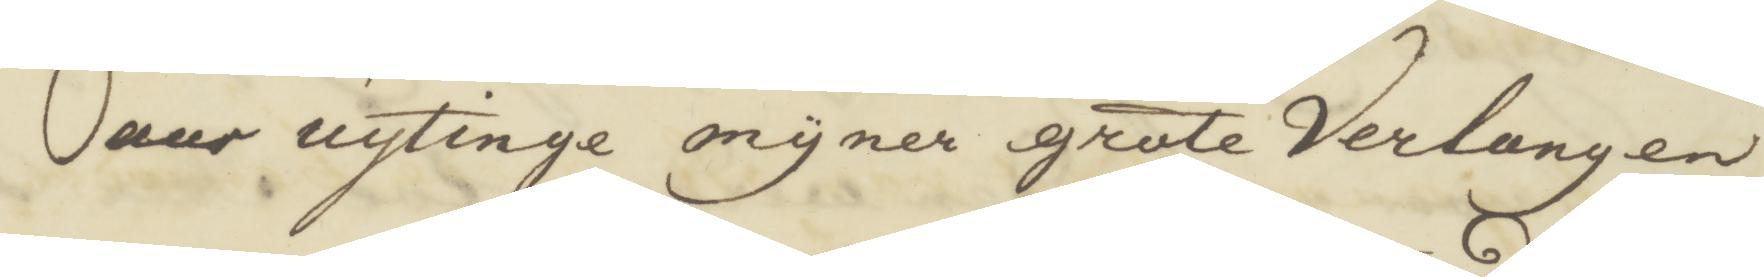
Naar uytinge mijner grote Verlangen
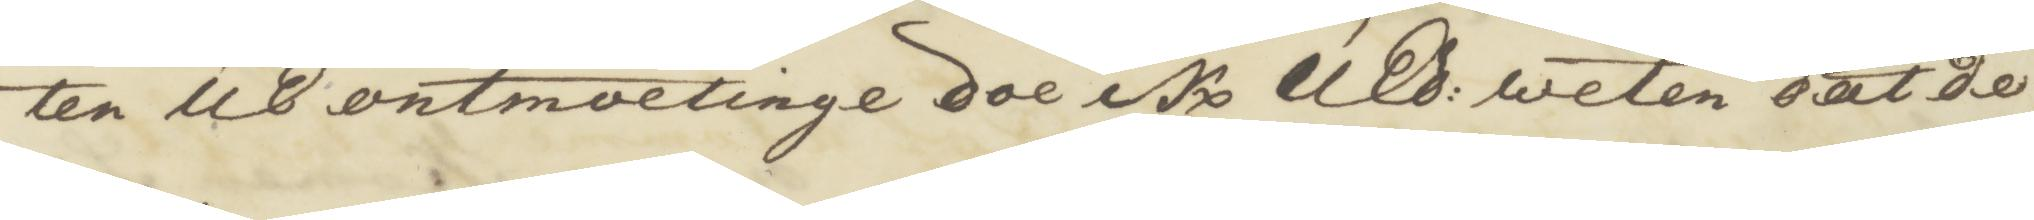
ten uE ontmoetinge doe ik UEd: weten dat de
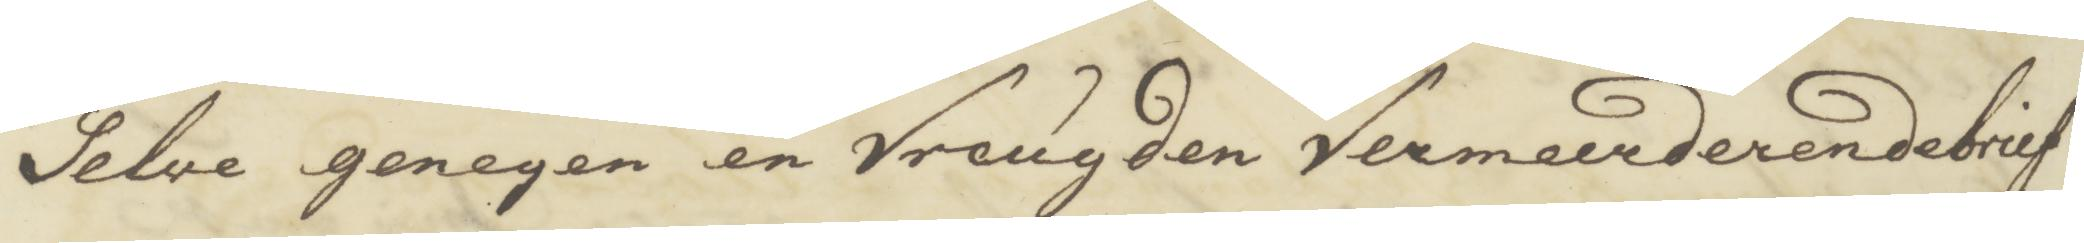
selve genegen en vreugden vermeerderende brief
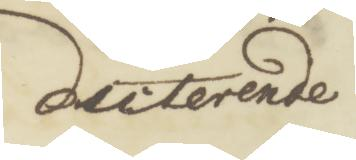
dicterende
